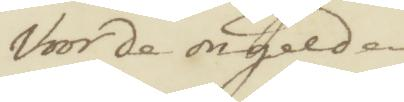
voor de ongelden
